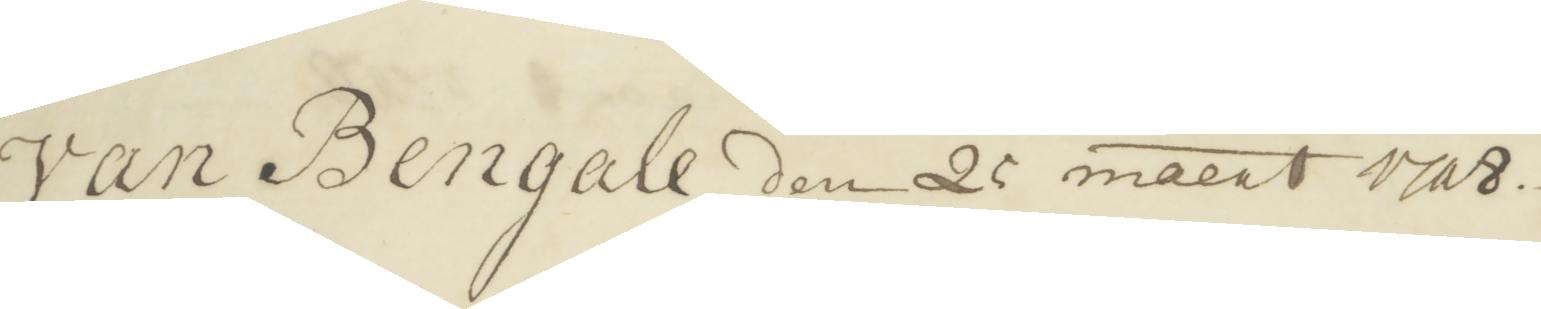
van Bengale den 25 maert 1748.
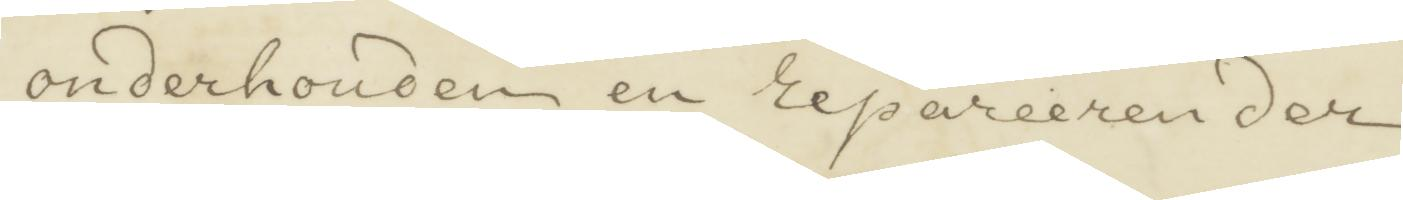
onderhouden en repareeren der
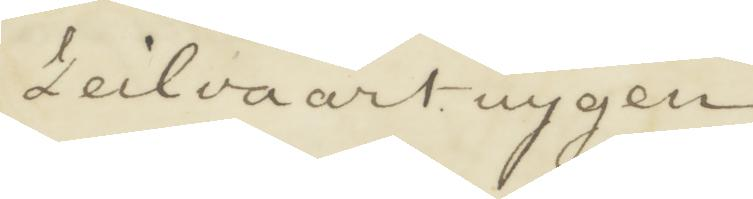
zeilvaartuijgen
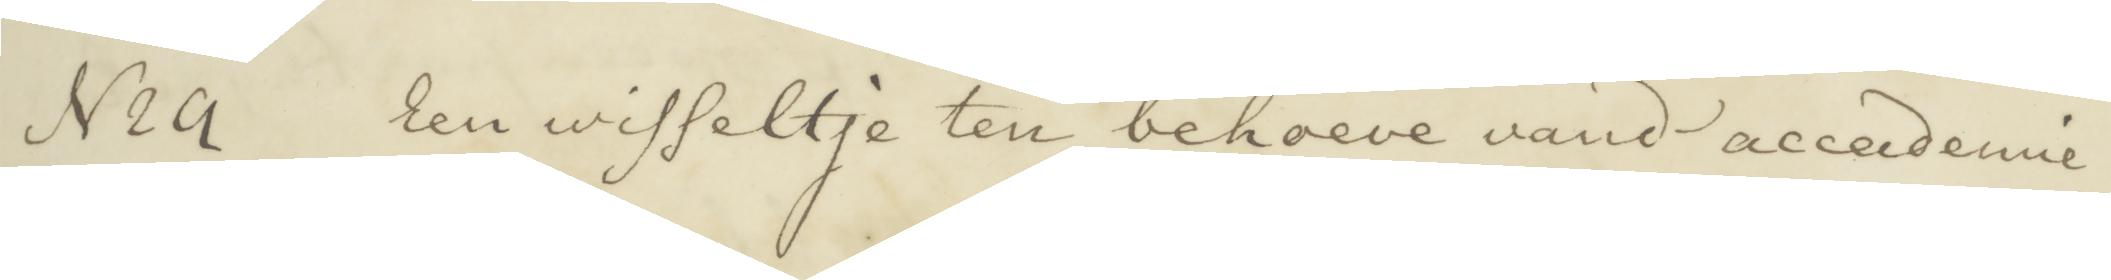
N24 hen wisseltje ten behoeve vand' accademie
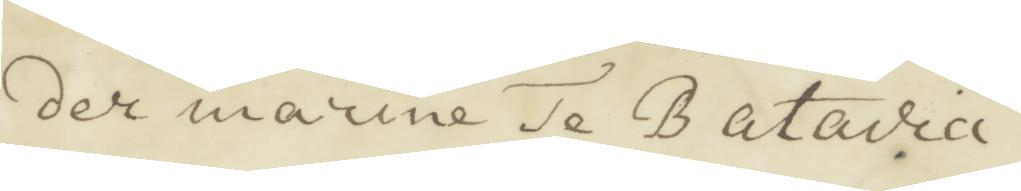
der marine Te Batavia
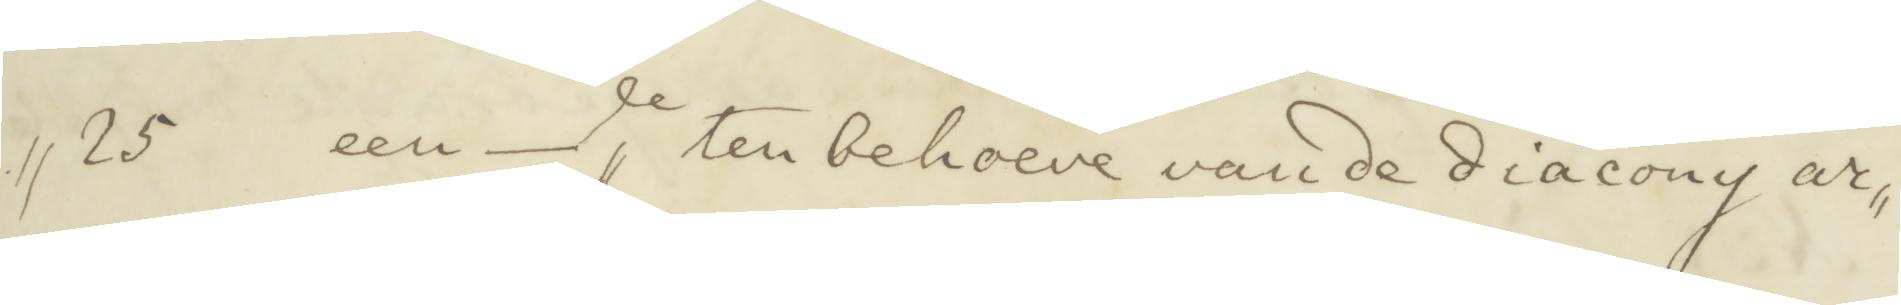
„ 25 een _„o ten behoeve van de diacony ar„
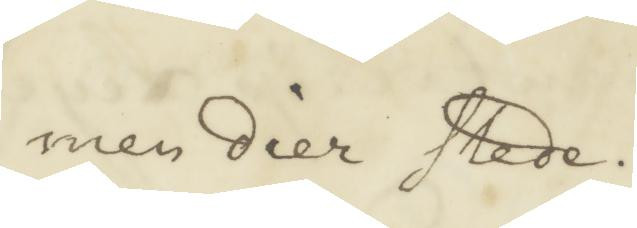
men dier stede.
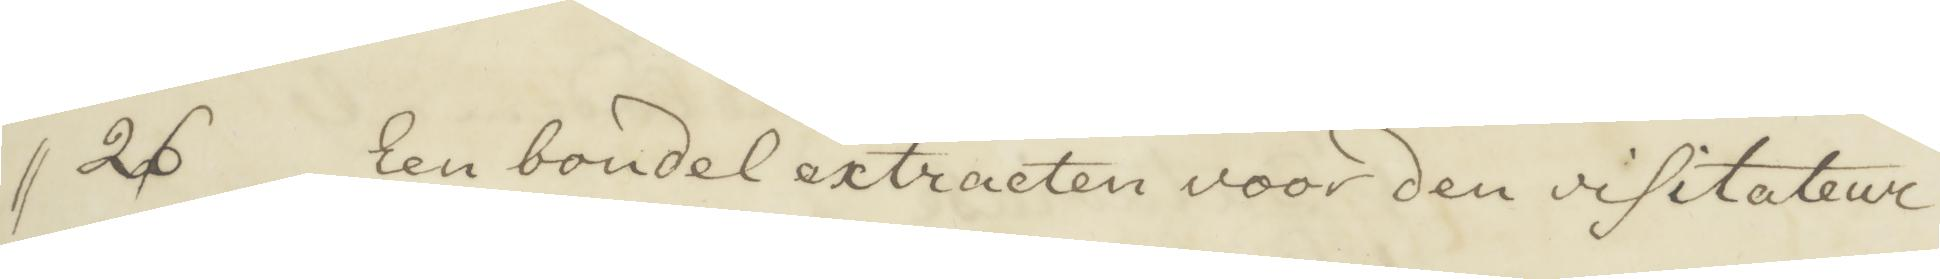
„ 26 Een bondel extracten voor den visitateur
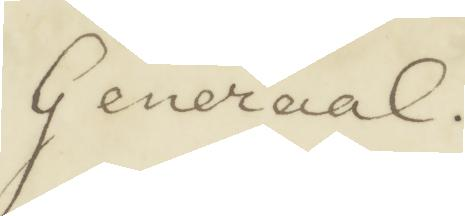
Generaal.
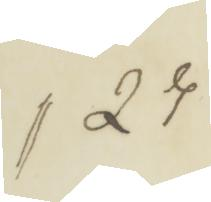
27
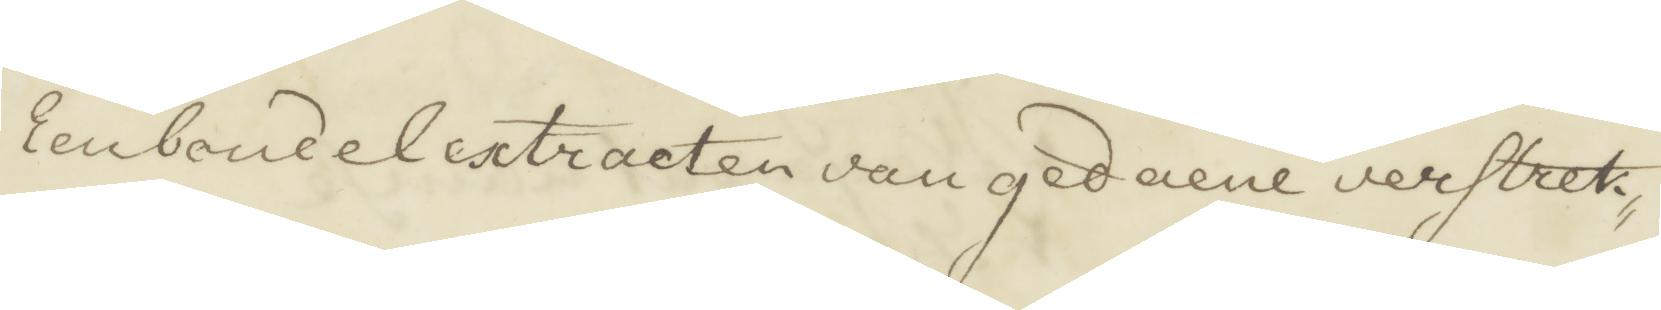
Een bondel extracten van gedaene verstrek„
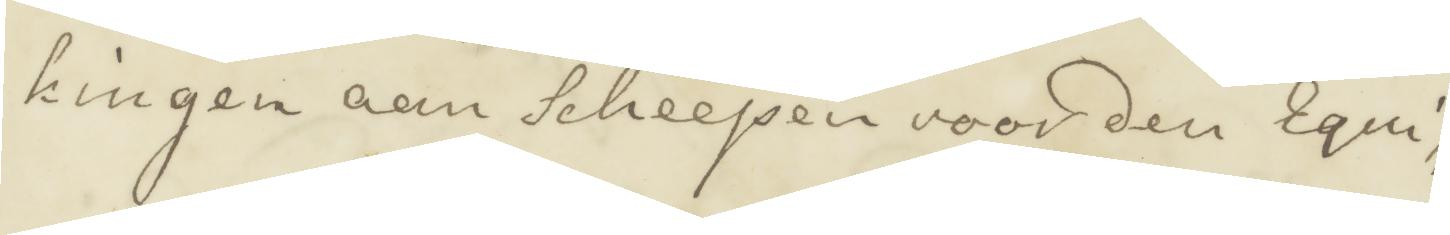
kingen aan scheepen voor den Equi
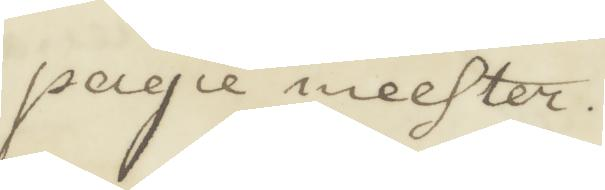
pagie meester.
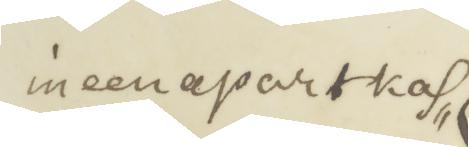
in een apart kas„
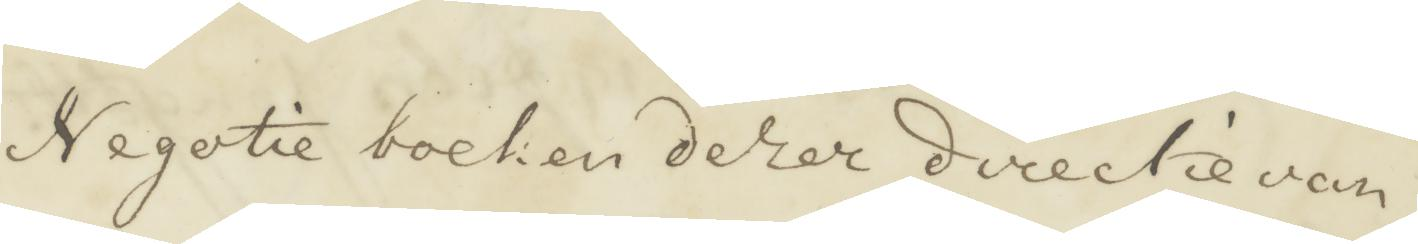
Negotie boeken dezer directie van
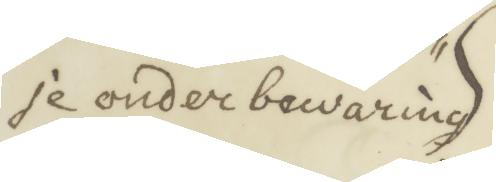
je onder bewaring
